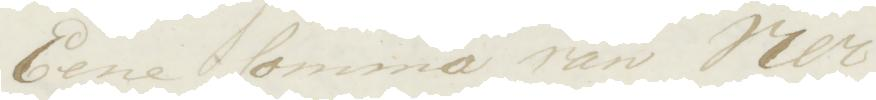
Eene somma van Vier
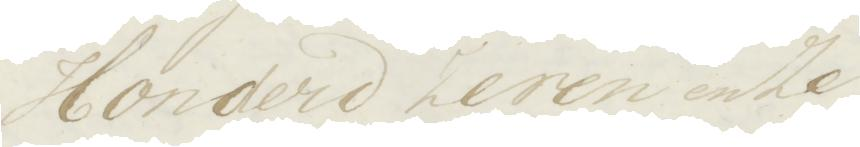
Honderd Zeven en Ze
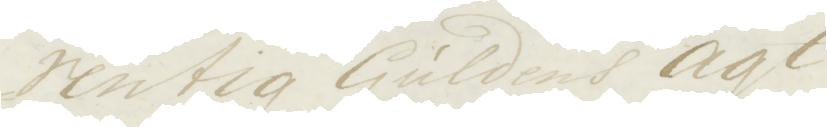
„ventig Guldens agt
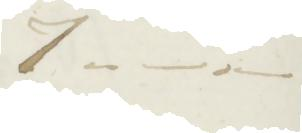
7 „ -.-
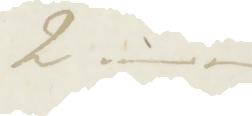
2 „ -.-
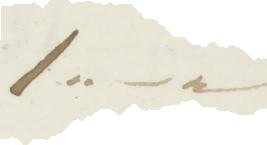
1 „ -.-
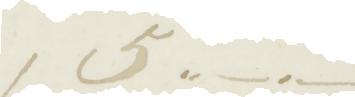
5 „ -.-
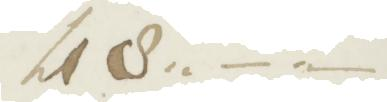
48 „ -.-
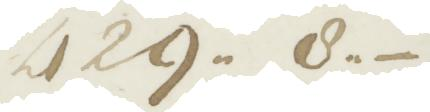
429 „ 8 „ -
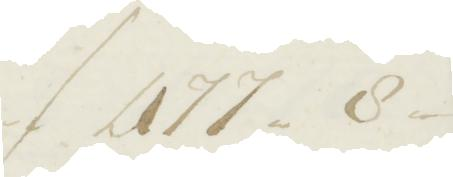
ƒ 477 „ 8 „ -
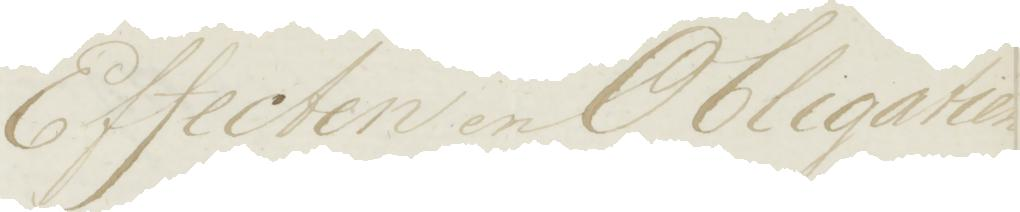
Effecten en Obligatie
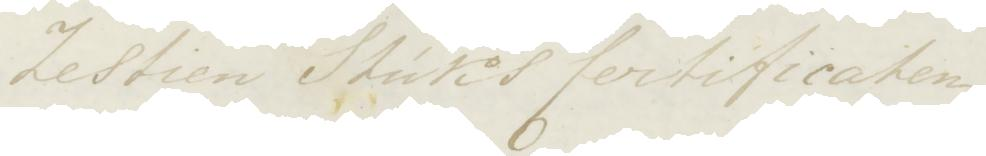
Zestien stuks Certificaten
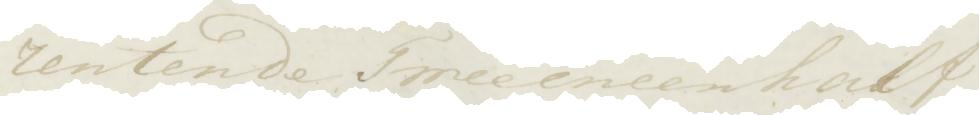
rentende Twee en een half
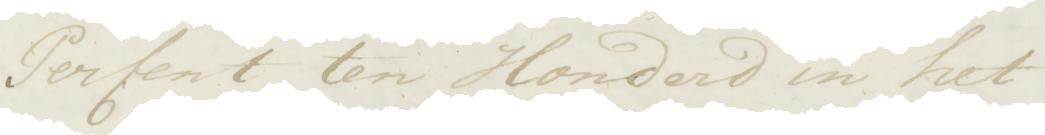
PerCent ten Honderd in het
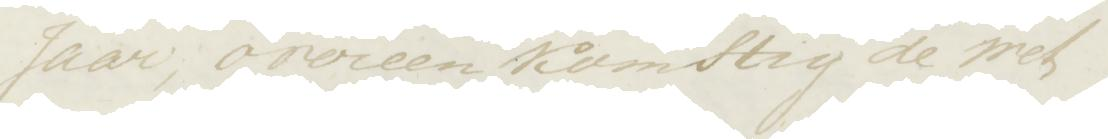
Jaar, overeen komstig de wet
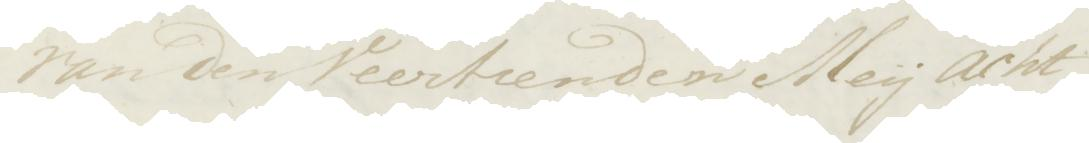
van den Veertienden Meij acht
